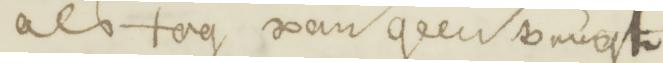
als tog van geen vruyt
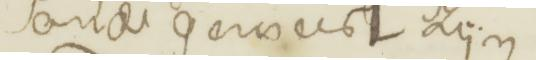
soude geweest zijn
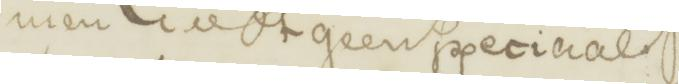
men heeft geen speciaal
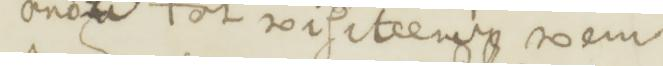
ordre tot visiteeren van
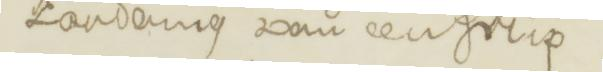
zoudanig van een schip
